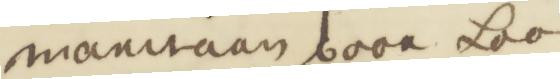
maritaan voor soo
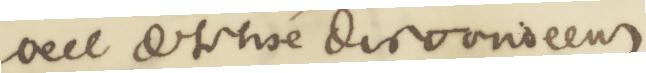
veel deselve discordeeren
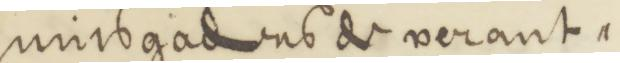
mitsgaders de verant„
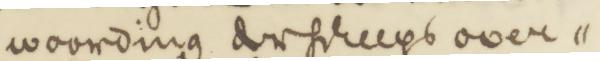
woording der scheeps over„
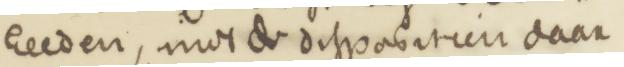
heeden, met de dispositien daar
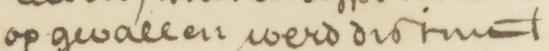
op gevallen werd distinct
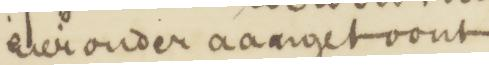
hier onder aangetoont
